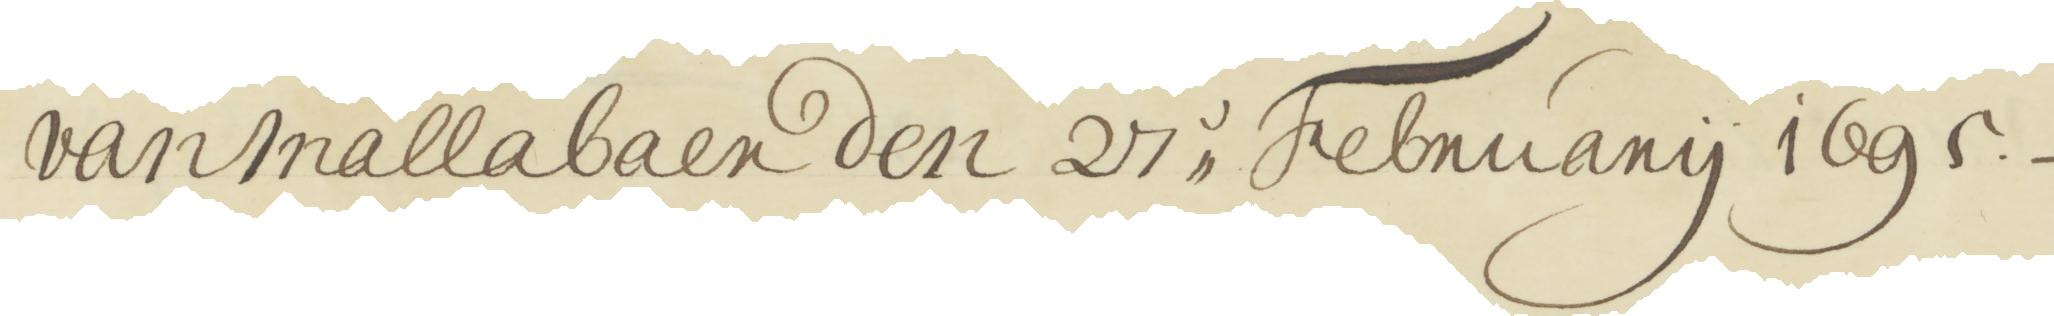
van mallabaer den 27„' Februarij 1695.
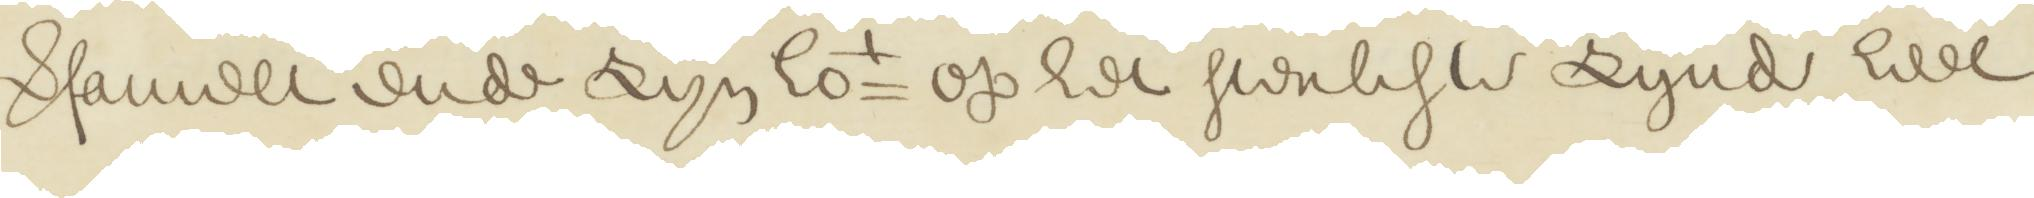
versamelt ende zijn ho=t op het sterkste zijnde heel
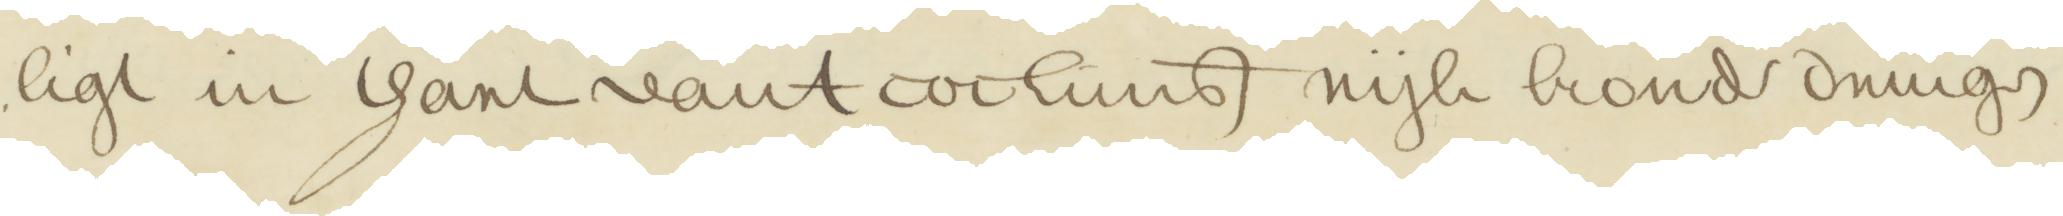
ligt in 'thart van't cochimsz rijk konde dringen
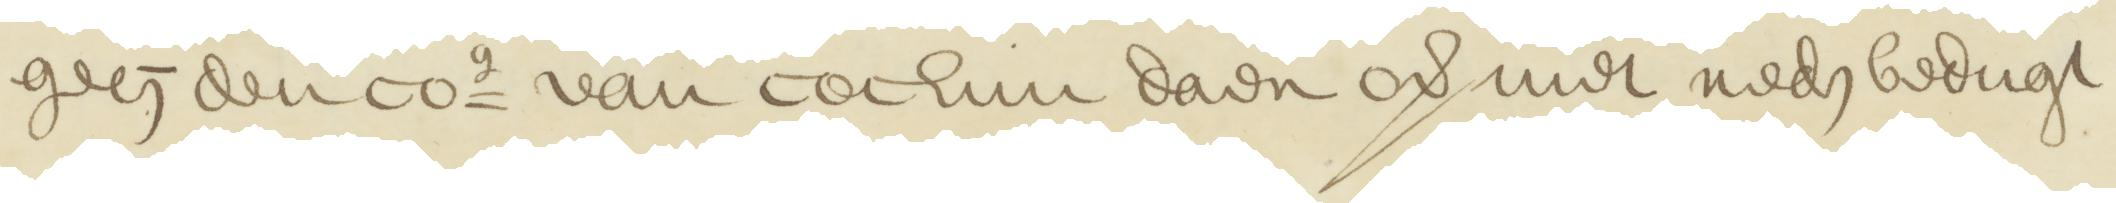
gelijk den co=g van cochim daer over met reden bedugt
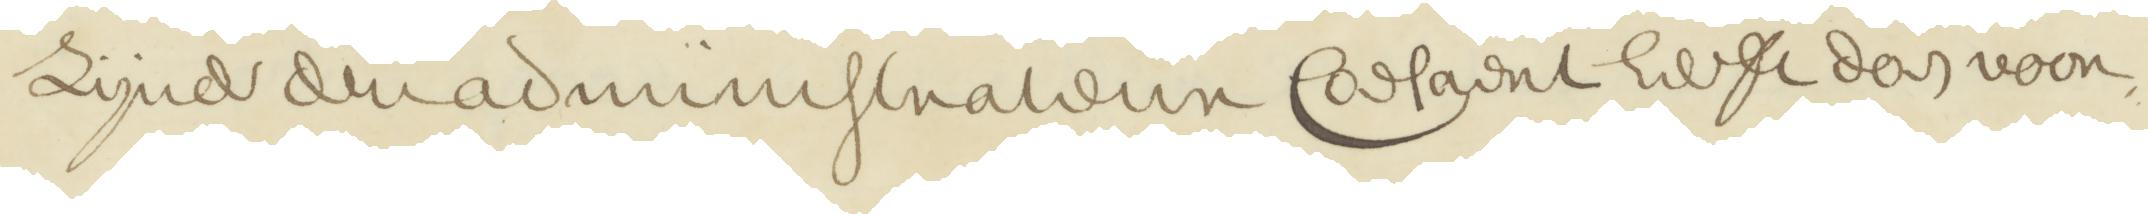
zijnde den administrateur Coesaert heeft doen voor„
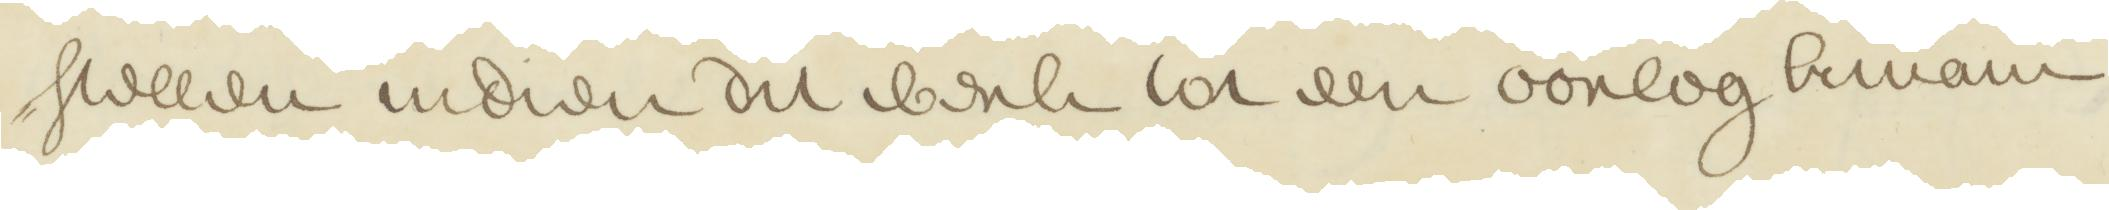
„stellen indien dit werk tot een oorlog kmam
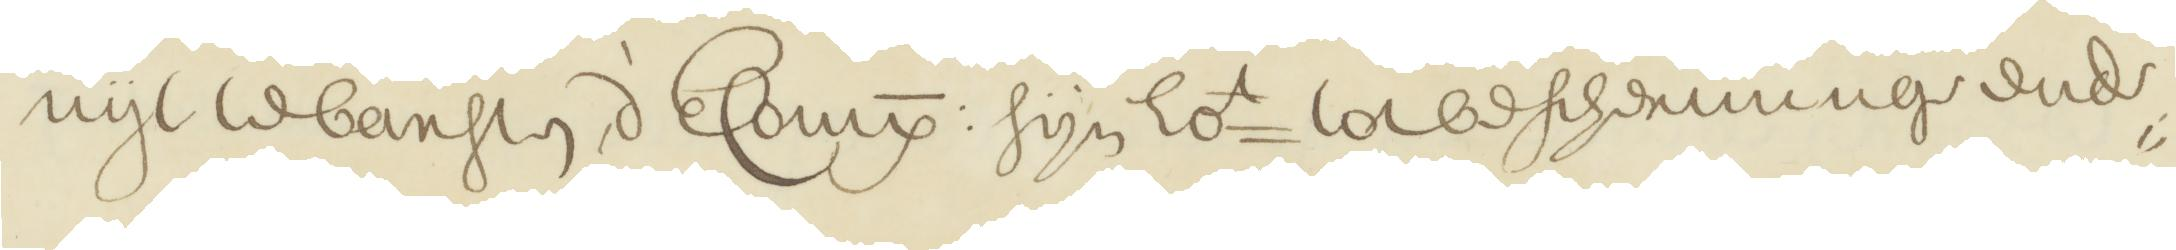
uijt te barsten, d'Ecomp: sijn ho=t tot bescherminge ende„
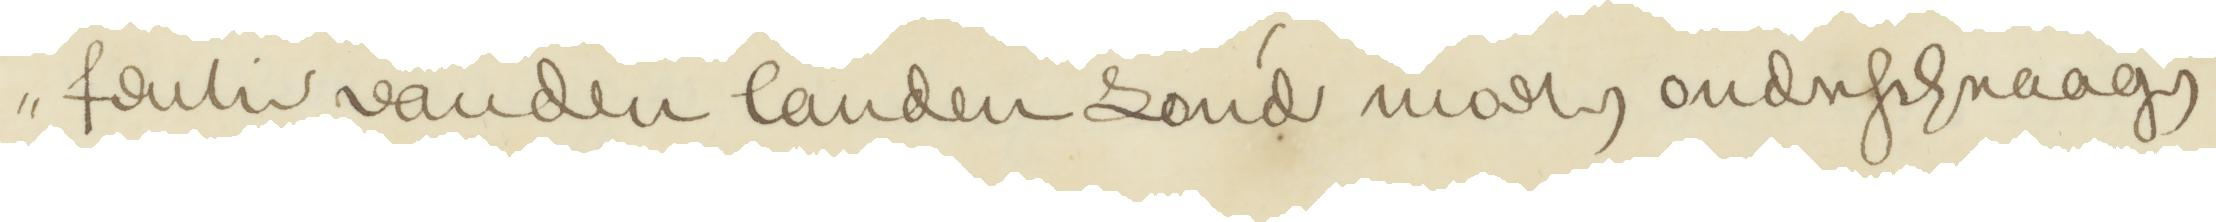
„fentie van den landen zoude moeten onderschraagen
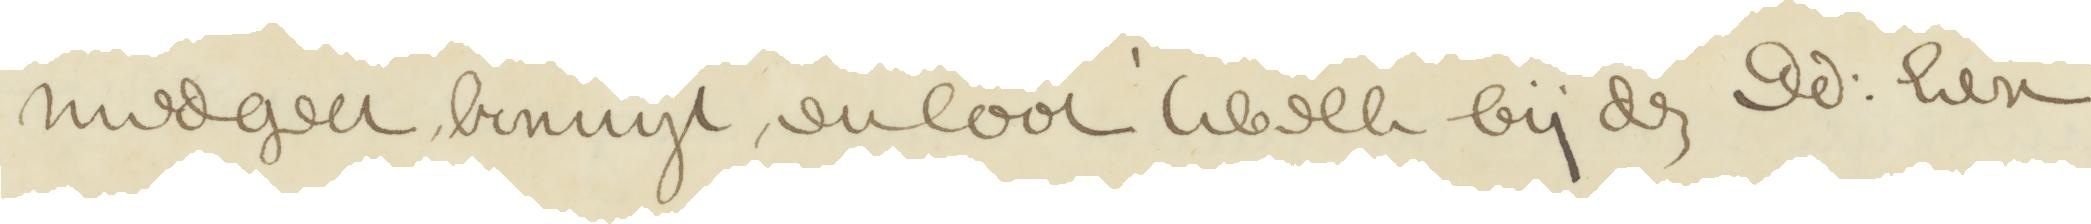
medgelt, kruijt, en loot 'twelk bij den Ed: her
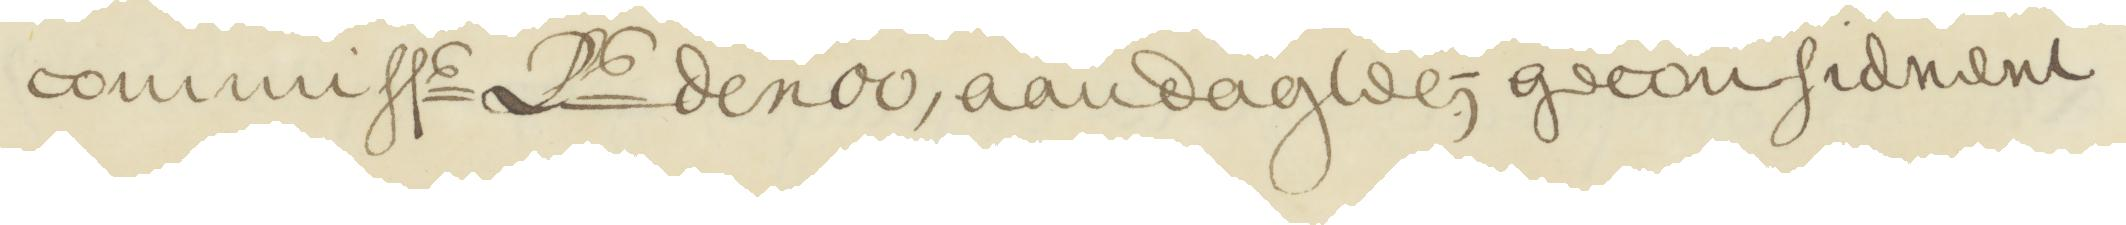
commiss=s P=s deroo, aandagtelijk geconsidrert
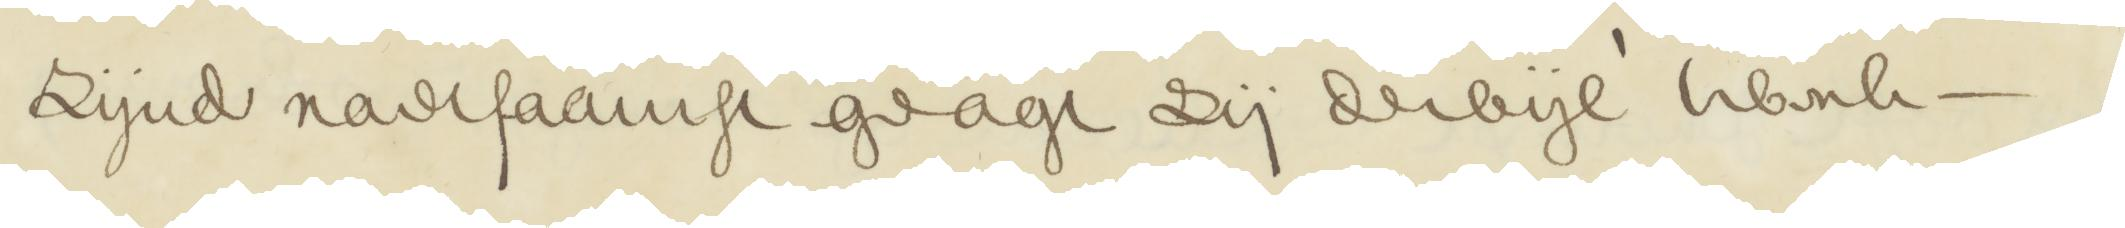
zijnde raetsaamst geagt zij dewijl 'twerk —
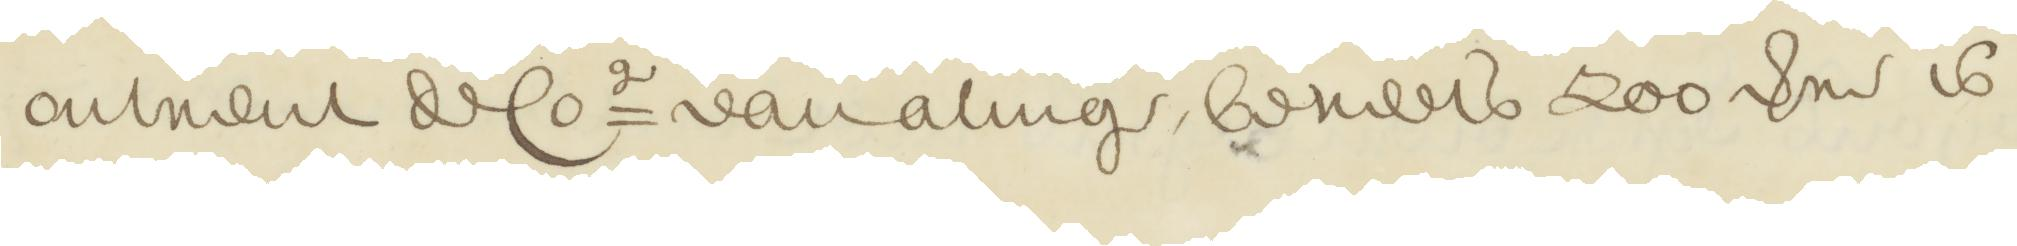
ontrent de Co=g van alinge, bereets zoo verre is
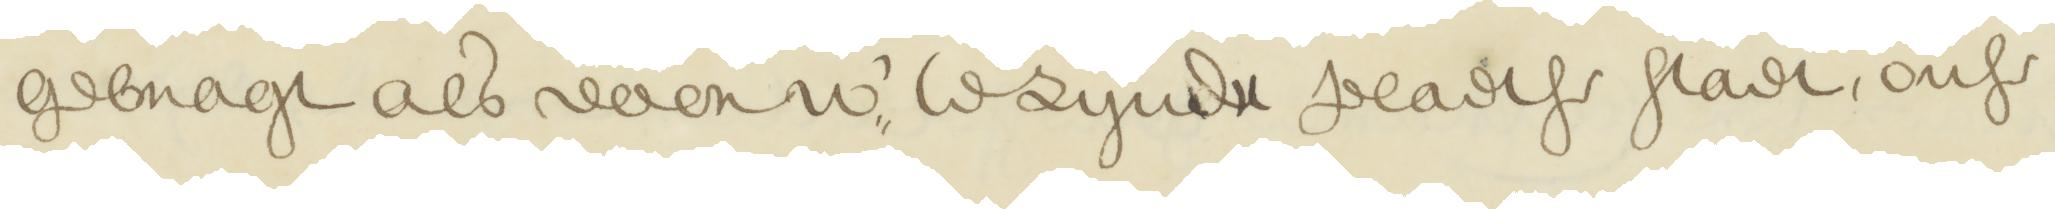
gebragt als voor w'„ts te zijner plaetse staet, onse
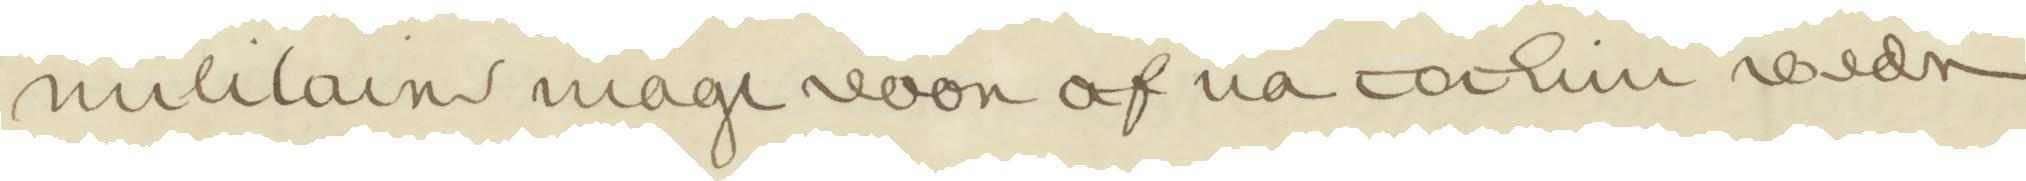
militaire magt voor af na cochim weder
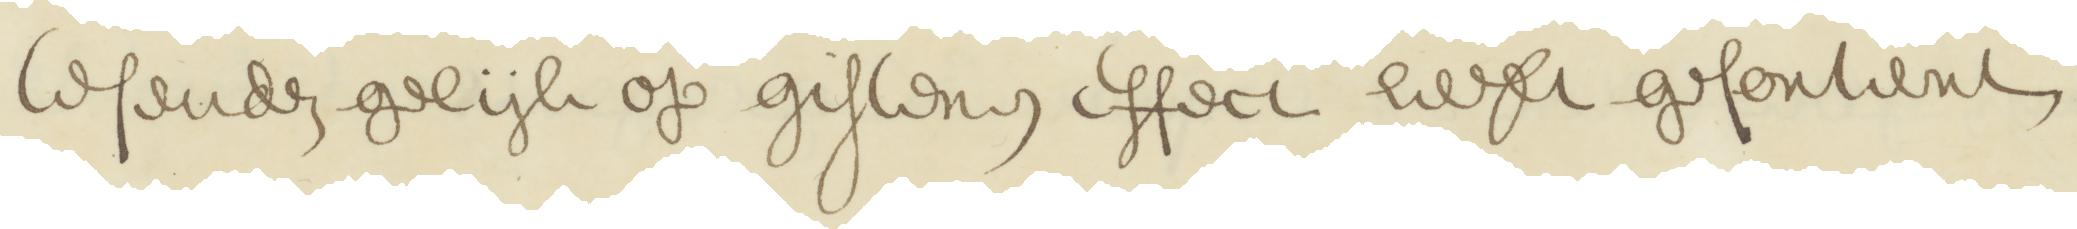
tesenden gelijk op gisteren Effect heeft gesorteert
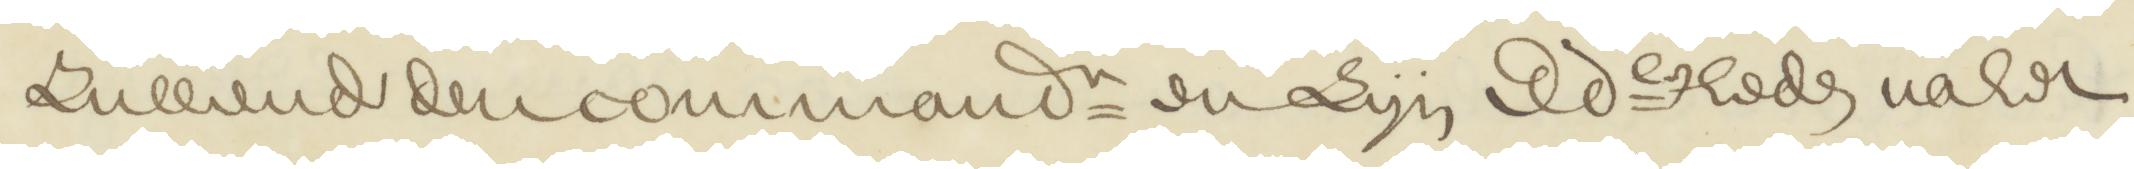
zullende den command=r en zijn Ed=len heden na het
